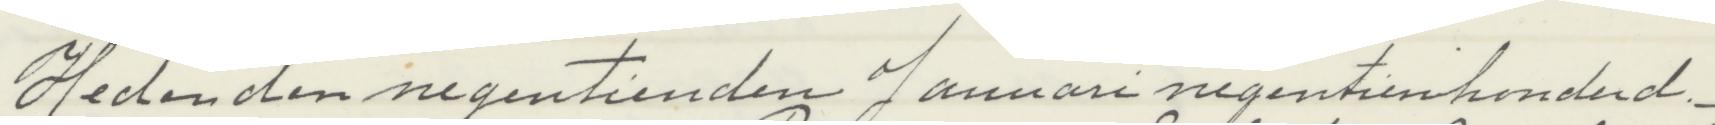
Heden den negentienden Januari negentienhonderd.
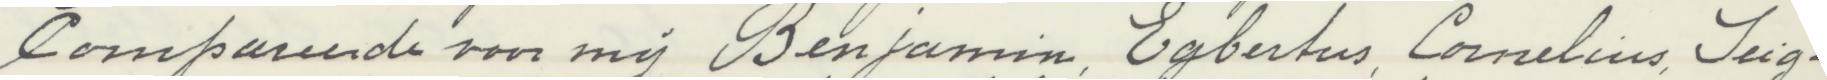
Compareerde voor mij Benjamin, Egbertus, Cornelius, Seig.
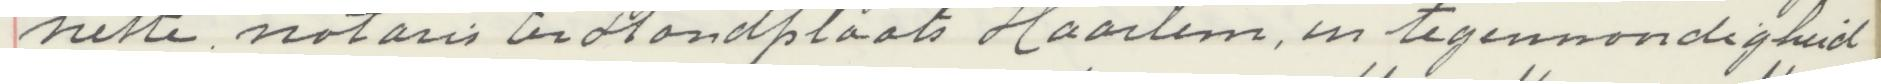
nette notaris ter standplaats Haarlem, in tegenwoordigheid
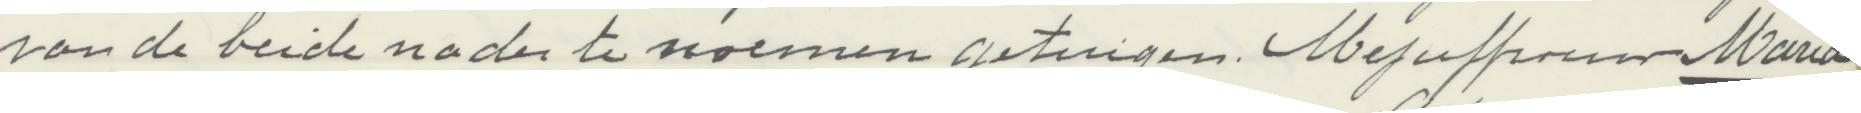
van de beide nader te noemen getuigen. Mejuffrouw Maria
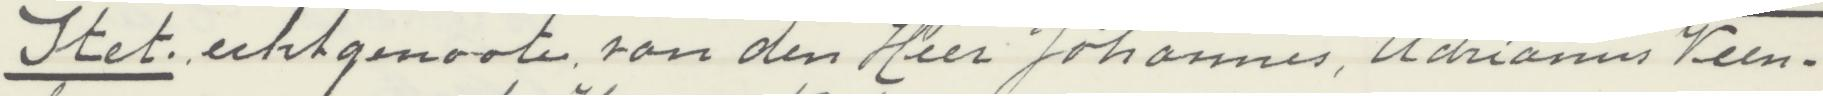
Stet. echtgenoote, van den Heer Johannes, Adrianus Veen-
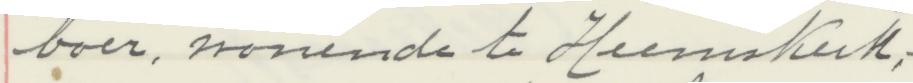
boer, wonende te Heemskerk,
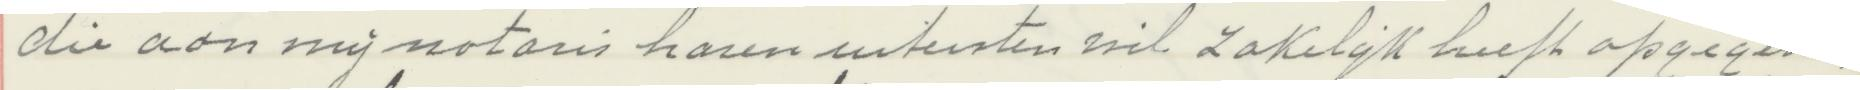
die aan mij notaris haren uitersten wil zakelijk heeft opgegeven,
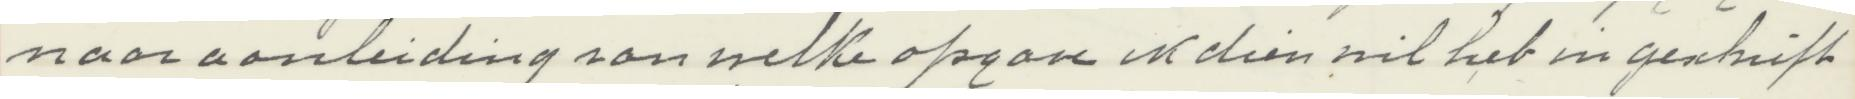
naar aanleiding van welke opgave ik dien wil heb in geschrift
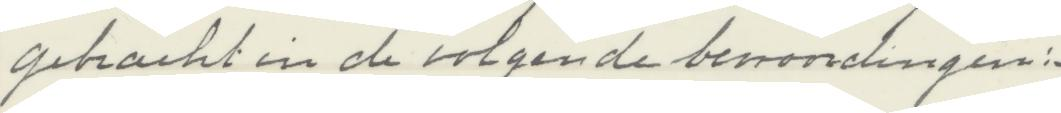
gebracht in de volgende bewoordingen:
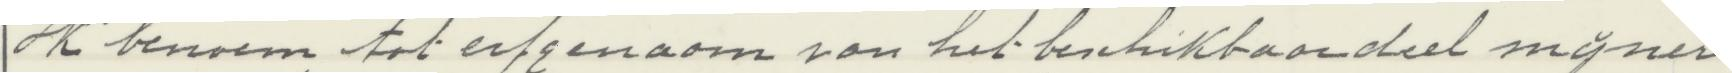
Ik benoem tot erfgenaam van het beschikbaar deel mijner
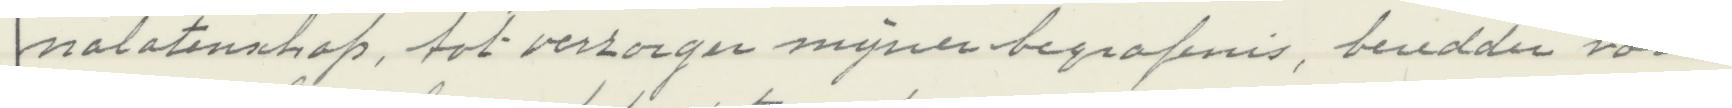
nalatenschap, tot verzorger mijner begrafenis, beredder voor
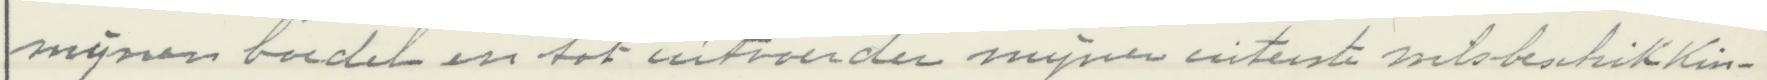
mijnen boedel en tot uitvoerder mijner uiterste wilsbeschikkin-
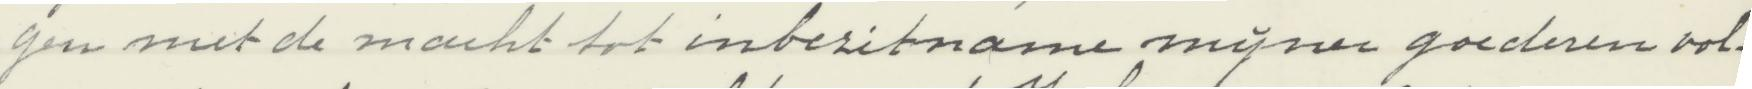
gen met de macht tot inbezitname mijner goederen vol-
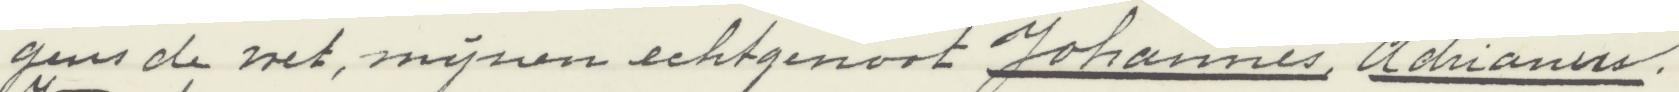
gens de wet, mijnen echtgenoot Johannes, Adrianus,
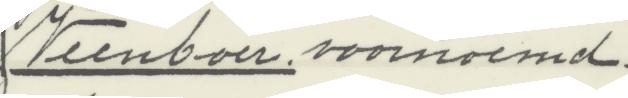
Veenboer, voornoemd
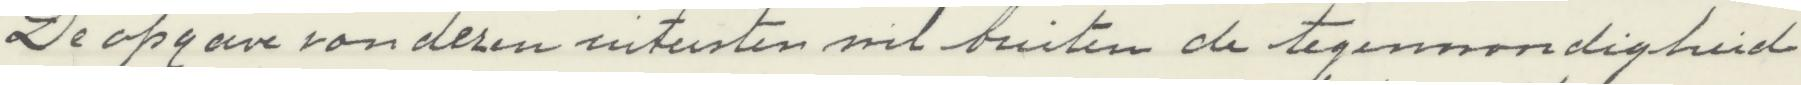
De opgave van dezen uitersten wil buiten de tegenwoordigheid
